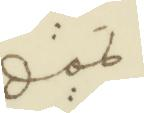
d:os
